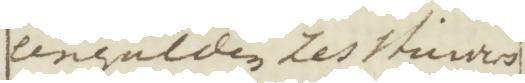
een gulden zes stuivers
